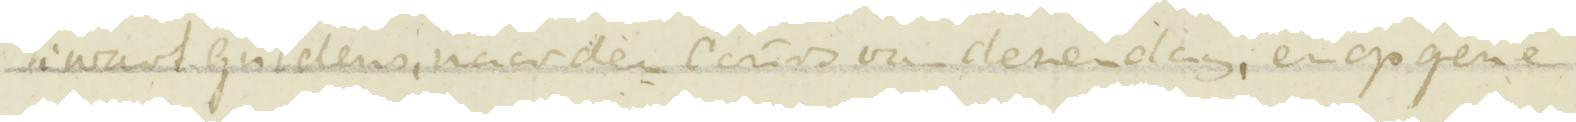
kwart Guldens, naar den cours van dezen dag, en op gene
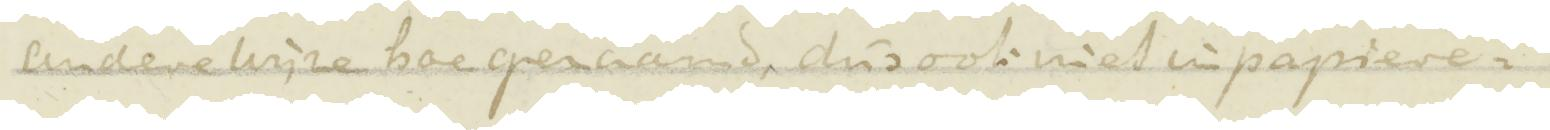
andere wijze hoe genaamd, dus ook niet in papieren
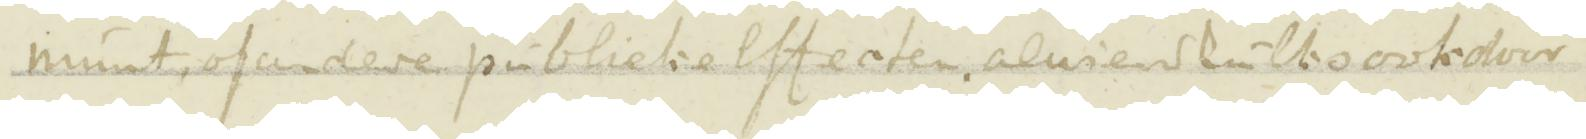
munt, of andere publieke effecten alwiens zulks ook door
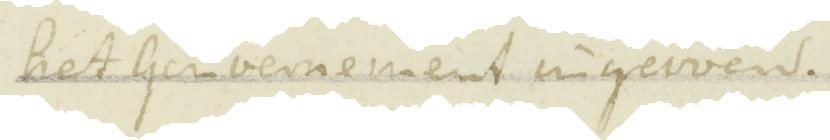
het Gouvernement in gevoerd.
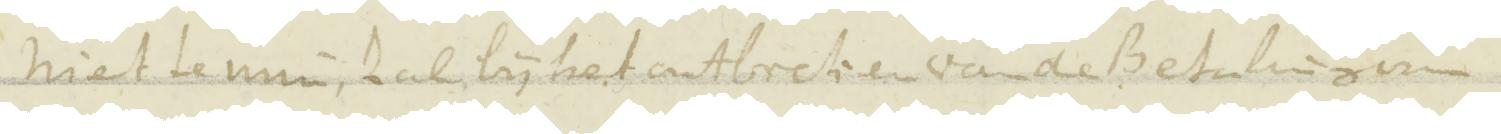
Niet te min, zal bij het ontbreken van de Betalingen
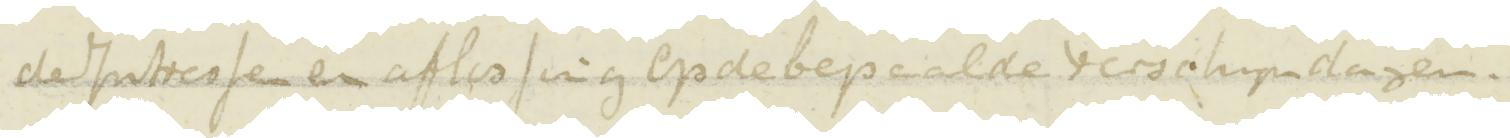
de Jntressenen aflossing op de bepaalde verschyndagen.
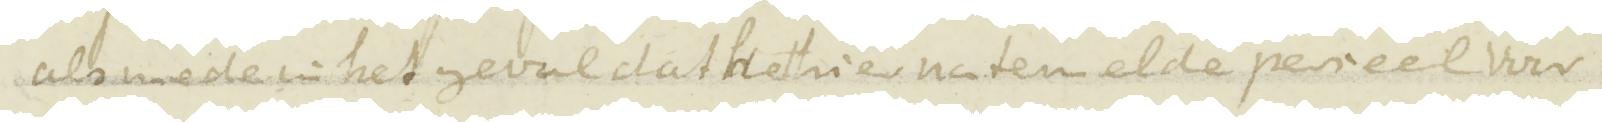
als mede in het geval dat het hier na temelde perceel voor
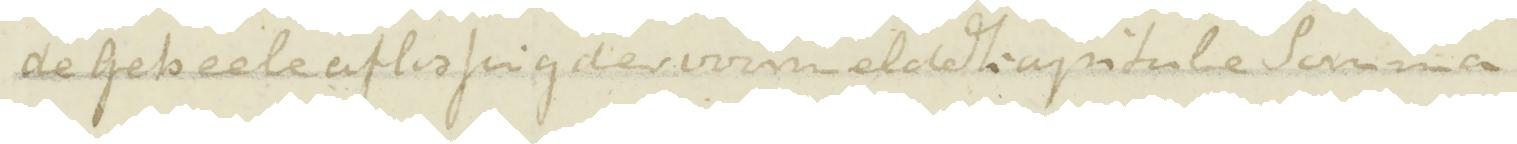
de geheele aflossing der voormelde kapitale somma
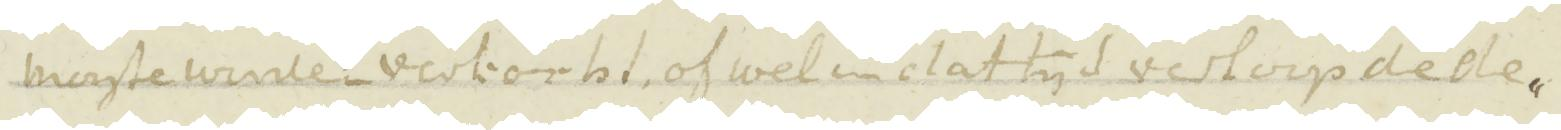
mogte worden verkocht, of wel in dat tijd verloop de de„
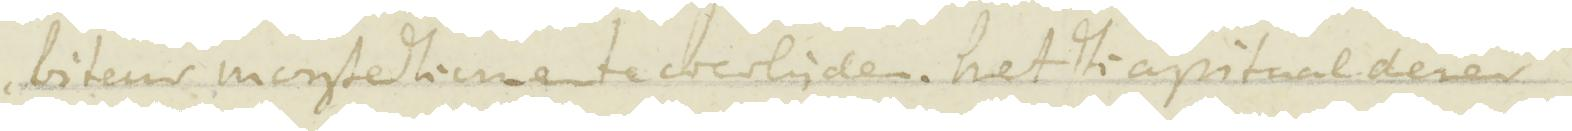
„biteur mogte komen te overlijden. het kapitaal dezer
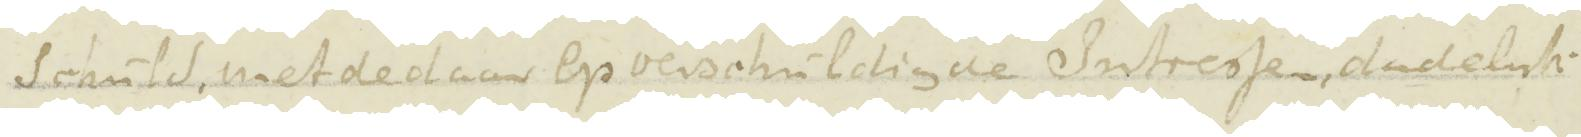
schuld met de daar op verschuldigde Jntressen, dadelyk
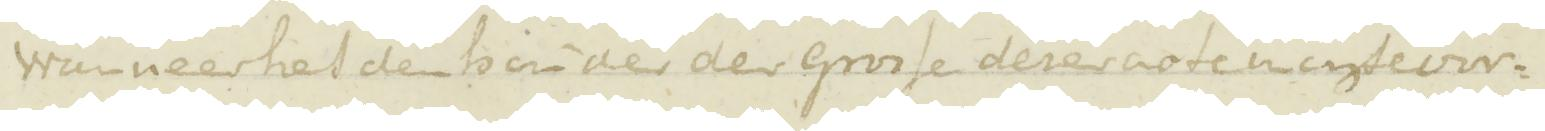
wanneer het den hinder der grosse dezer note mogte vor=
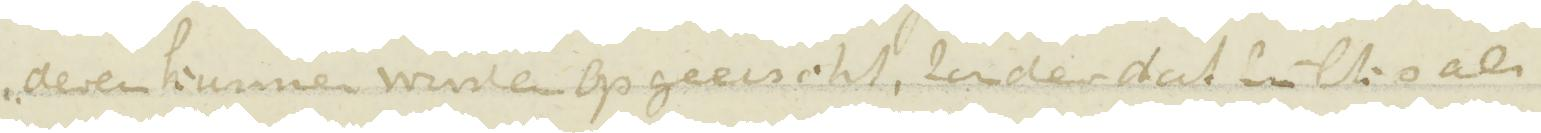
„deren kunnen worden op geeischt, zonder dat zulks als
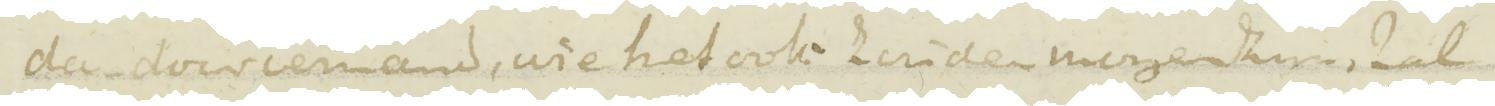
dan door iemand, wie het ook zouden mogen zyn, zal
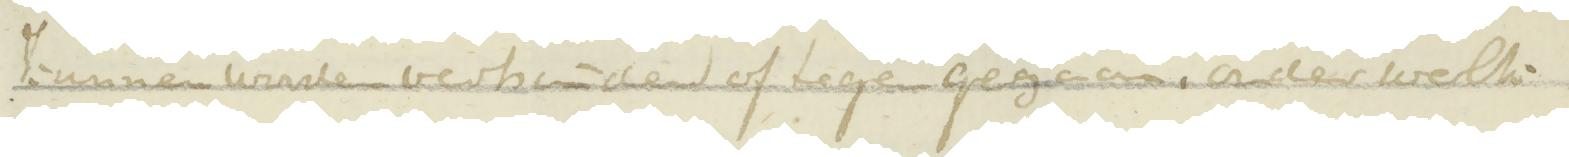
kunnen worden verhouden of tegen gegaan, onder welk
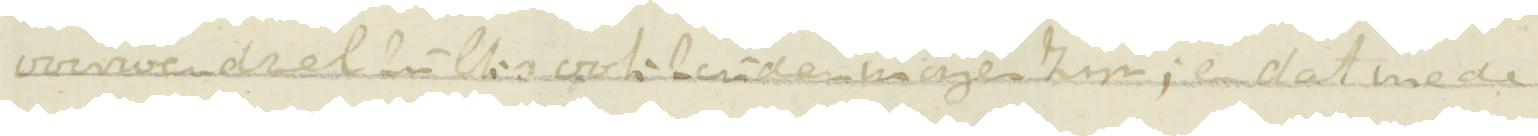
voorwendzel zulks ook zouden mogen zijn; en dat mede
